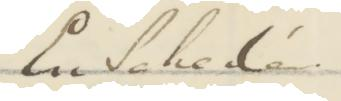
Enschedé
